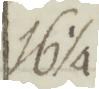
16¼
